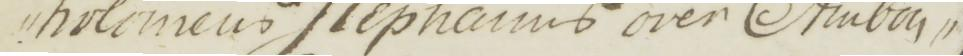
„holomeus Stephanus over Amboi„
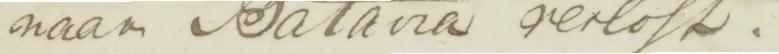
naar Batavia verlost.
